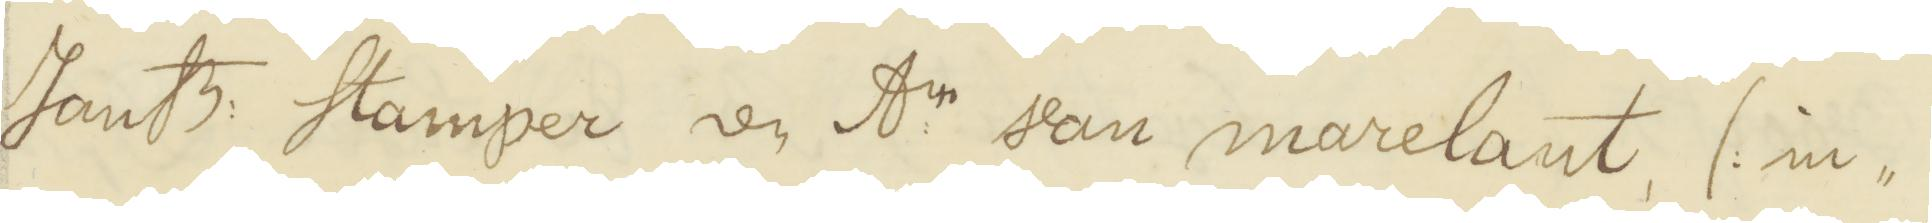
Jansz: Stamper en A:m van marelant, (:in„
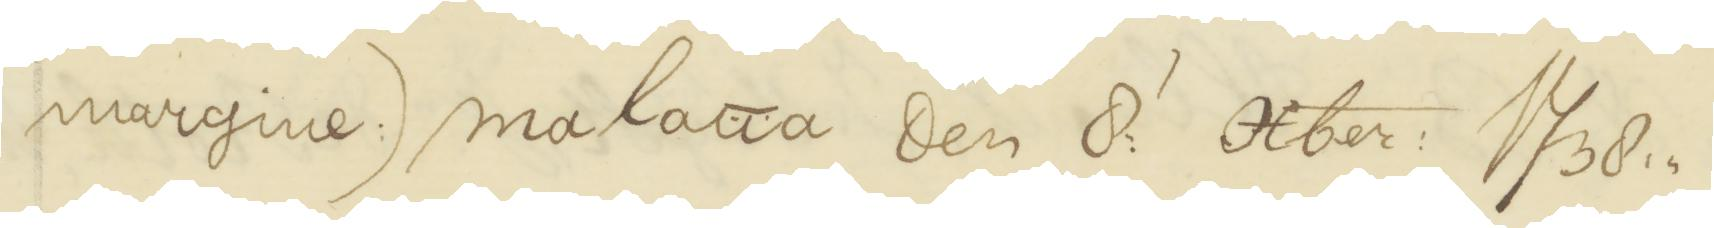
margine:) malacca den 8:' xber: 1738.„
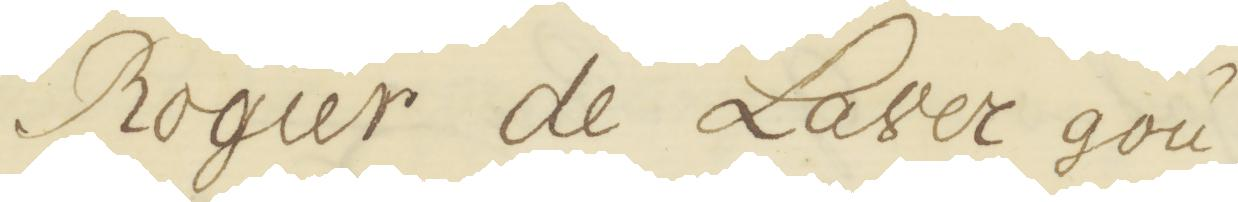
Rogier de Laver gou
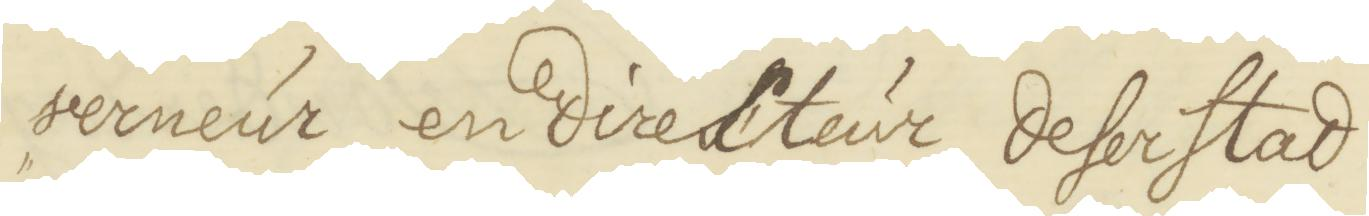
„verneur en directeur deserstad
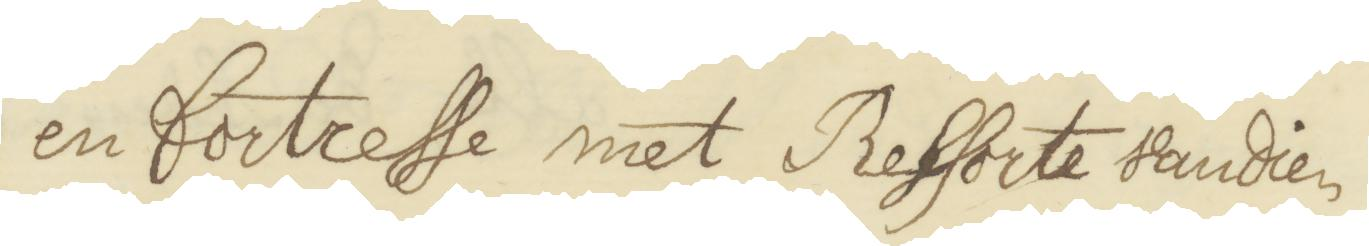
en fortresse met Ressorte van dien
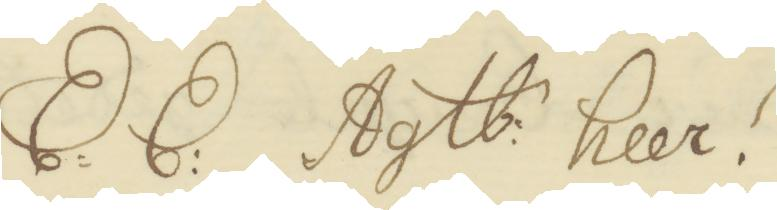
E: E: Agtb: heer!
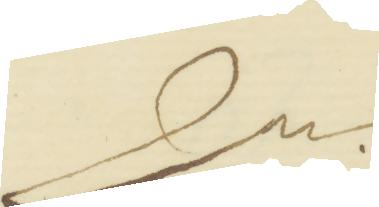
Jn.
